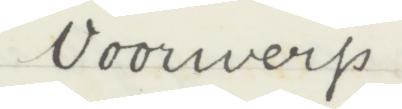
Voorwerp
